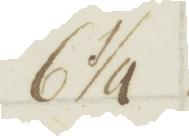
6 1/4
